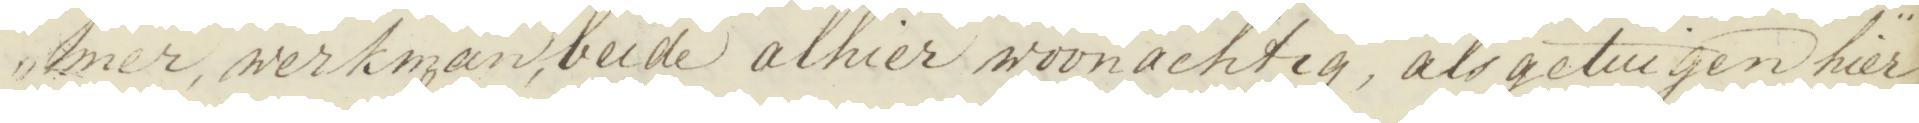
„mer, werkman, beide alhier woonachtig, als getuigen hier,
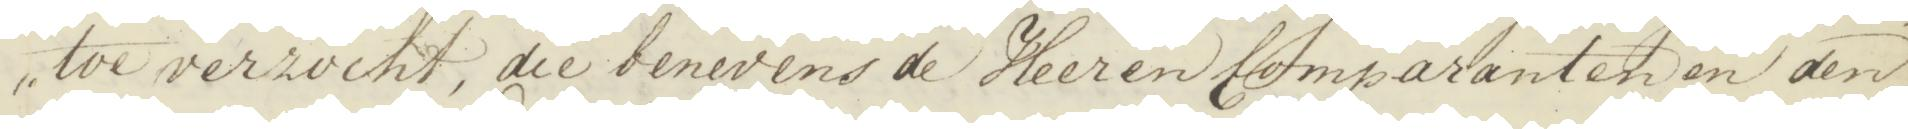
„toe verzocht, die benevens de Heeren Comparanten en den
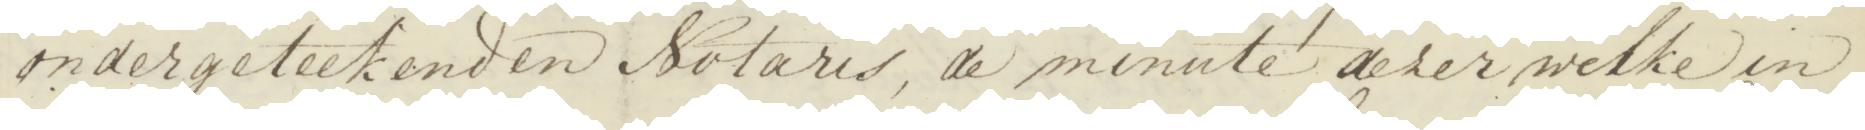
ondergeteekenden Notaris, de minute dezer welke in
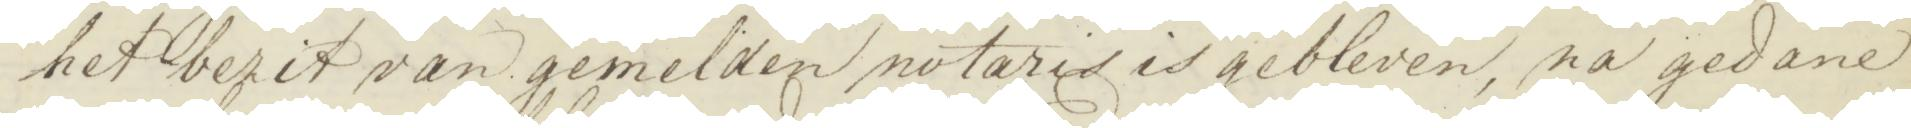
het bezit van gemelden notaris is gebleven, na gedane
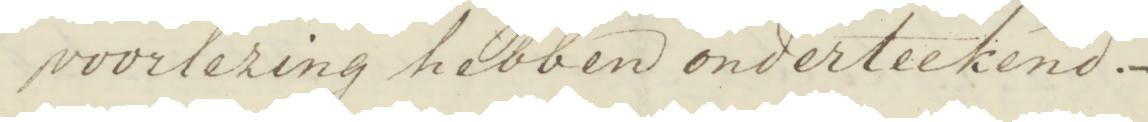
voorlezing hebben onderteekend. —
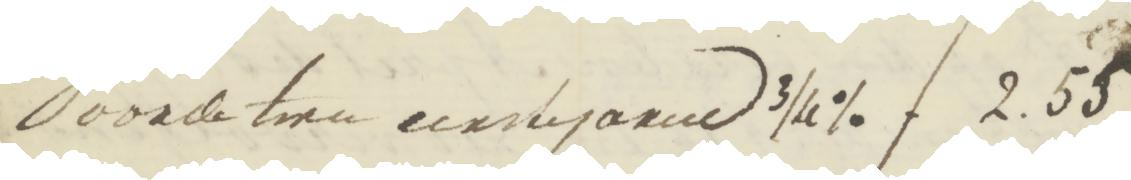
Voor de twee eerste jaren ¾% ƒ 2. 55
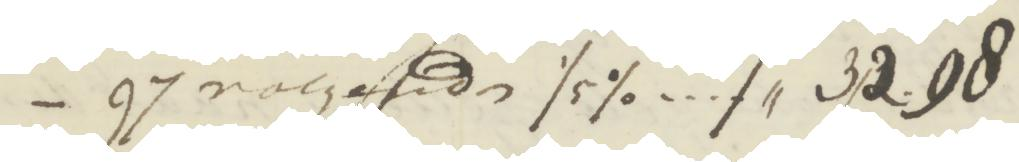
— 97 volgende 1/5% . . . ƒ „ 32. 98
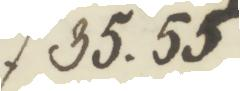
ƒ 35. 53
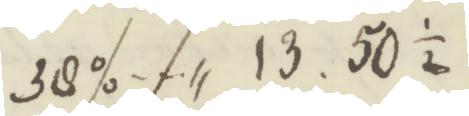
38% - ƒ.„ 13. 50½
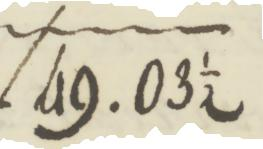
ƒ 49. 03½
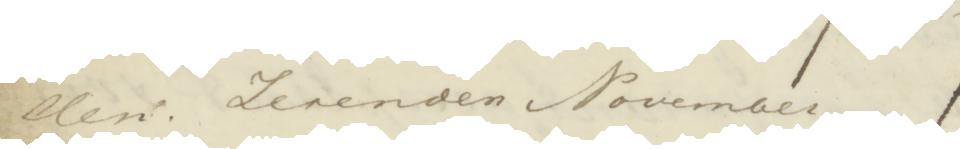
den. Zevenden November
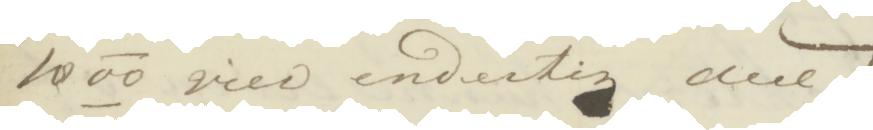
1800 vier endertig deel
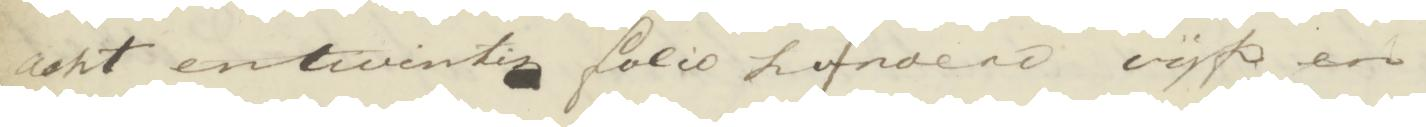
acht en twintig folio honderd vijf en
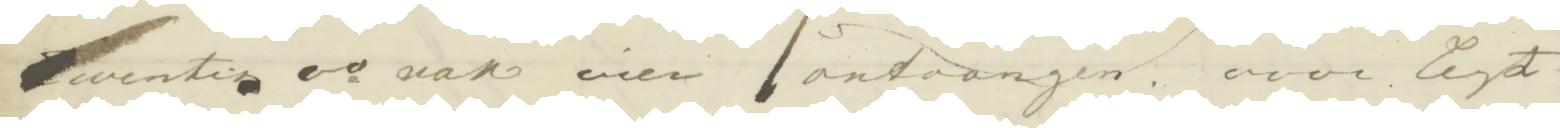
twintig v=o vak vier ontvangen. voor Eerst
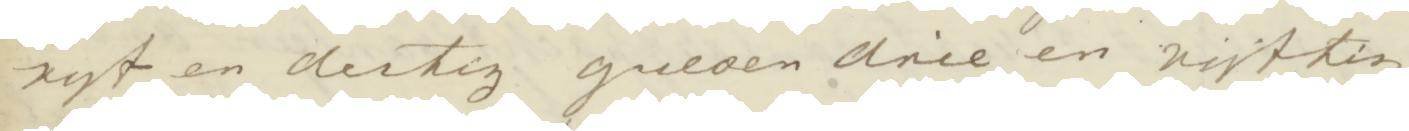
vyf en dertig gulden drie en vijftig
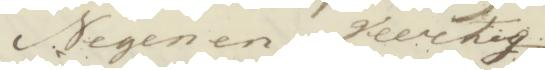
Negen en Veertig
